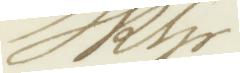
IKSjr
